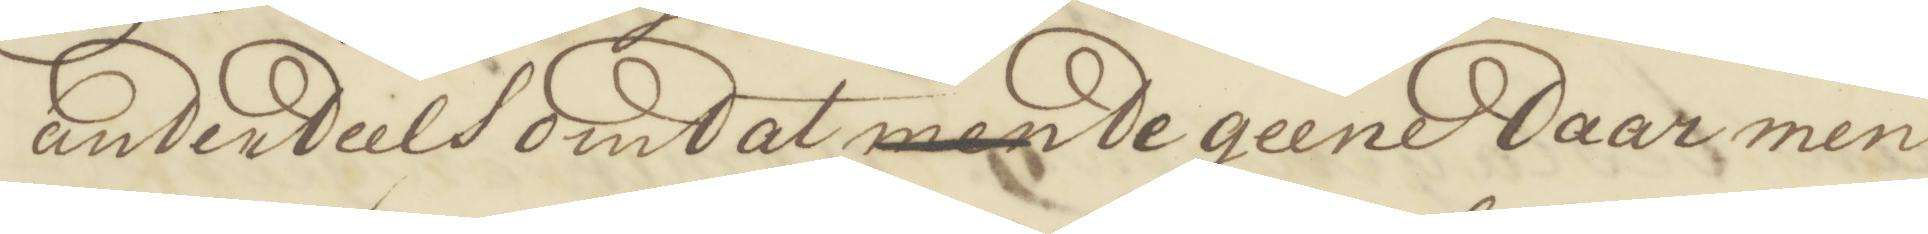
anderdeels om dat men de geene daar men
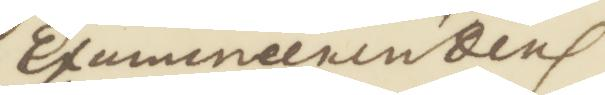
Examineeren der
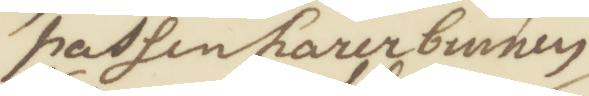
passen harer binnen
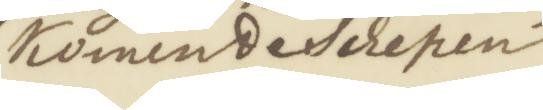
komende schepen
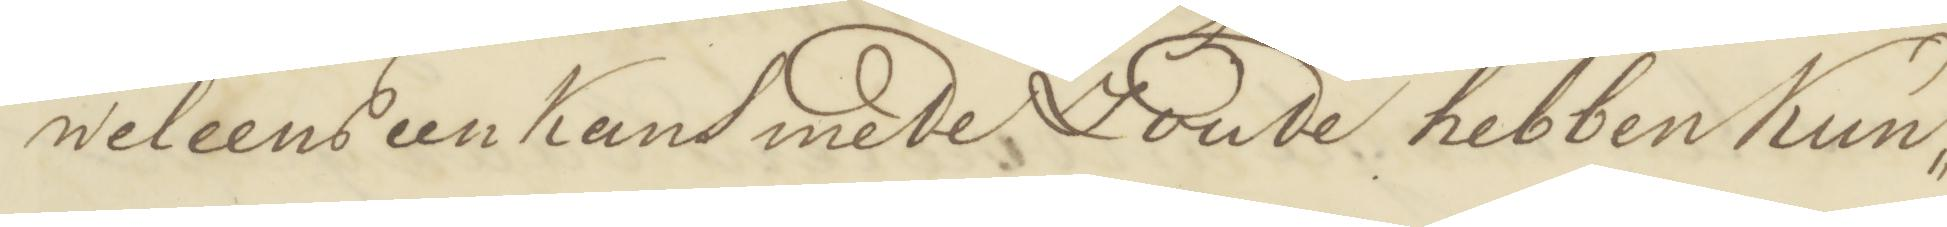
weleens een kans mede zoude hebben kun„
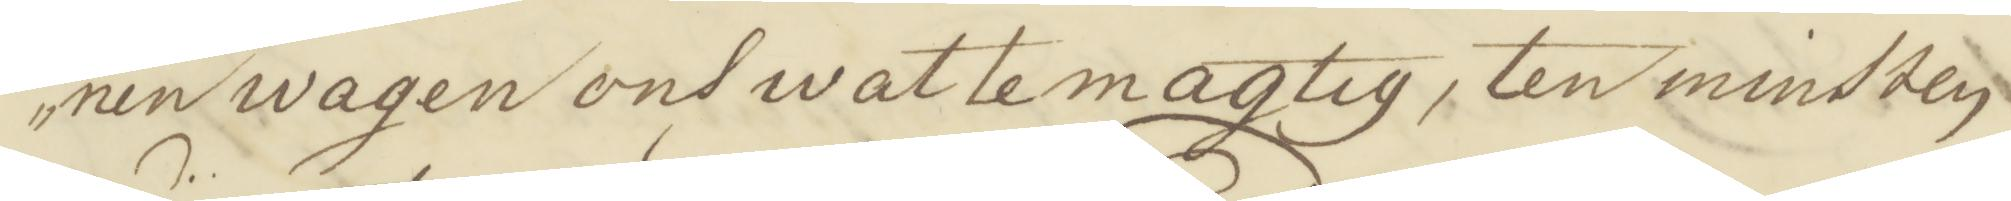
„nen wagen ons wat te magtig, ten minsten
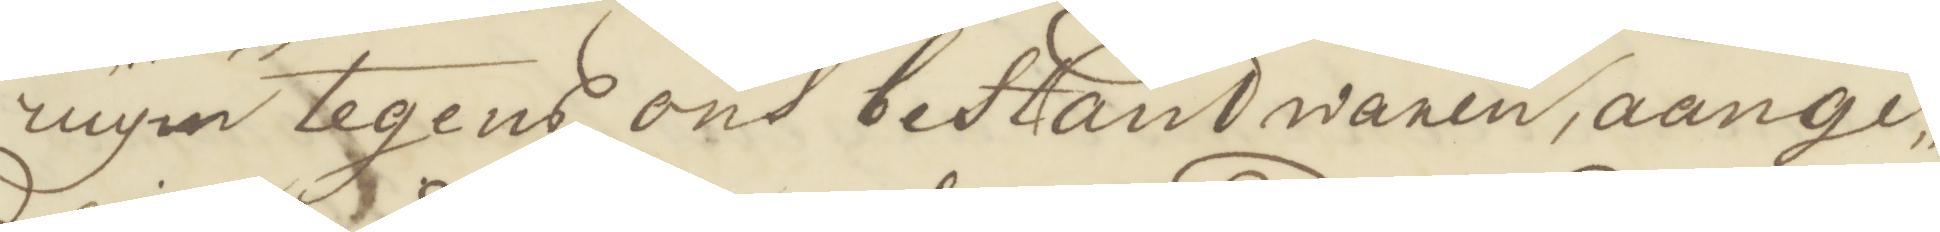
ruijm tegens ons bestand waren, aange„
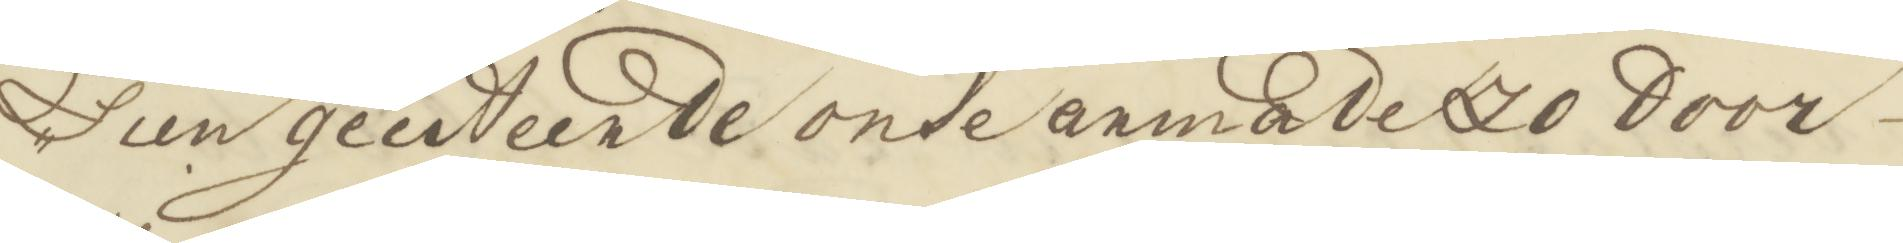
„sien geciteerde onse armade zo door
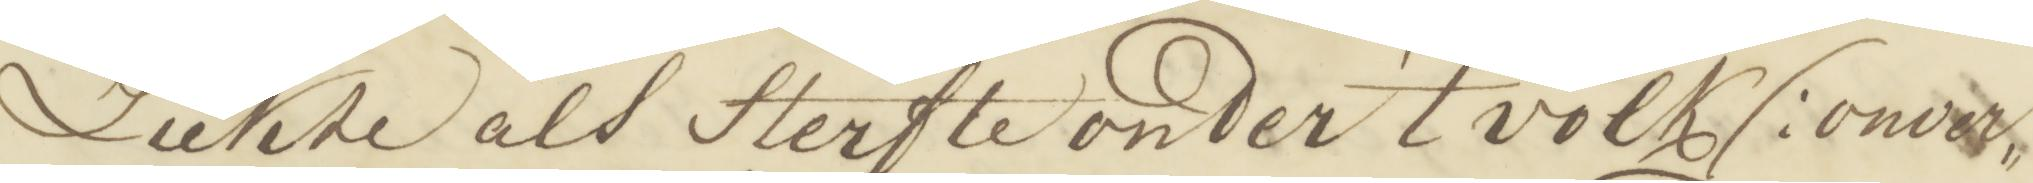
ziekte als sterfte onder ’t volk (:onver„
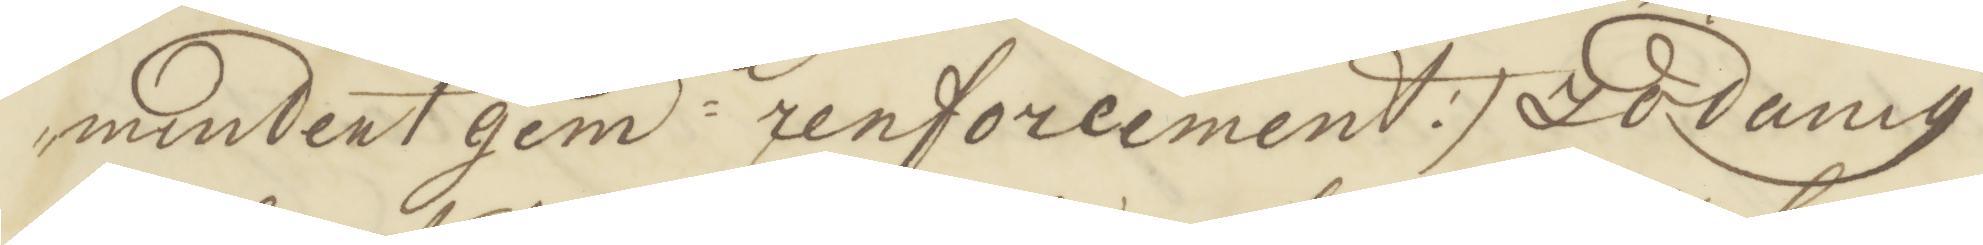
„mindert gem:te renforcement:) zodanig
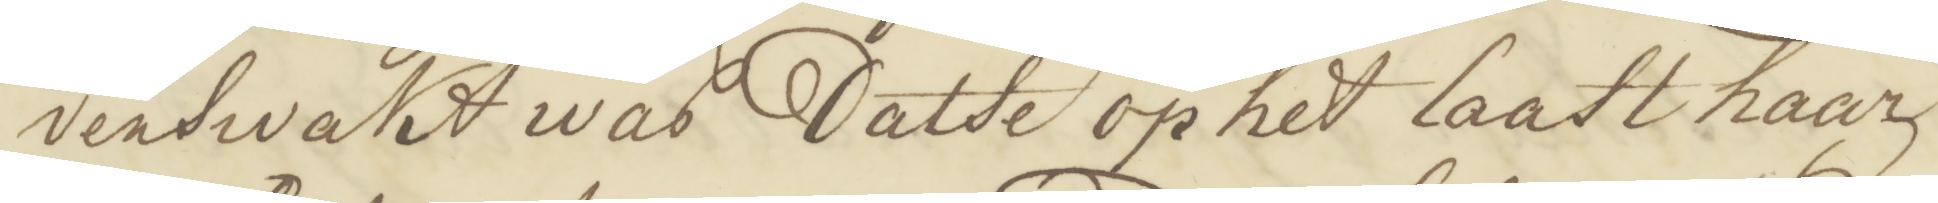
verswakt was datse op het laast haar
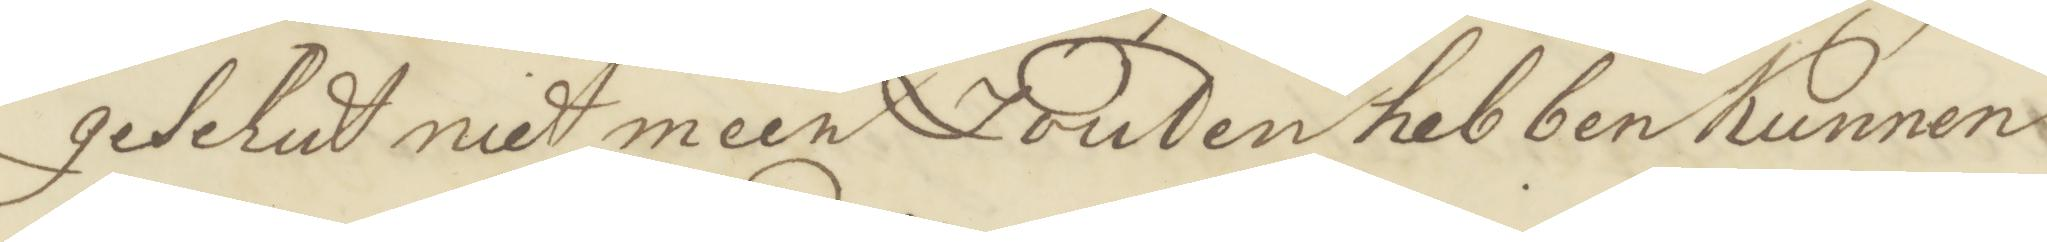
geschut niet meer zouden hebben kunnen
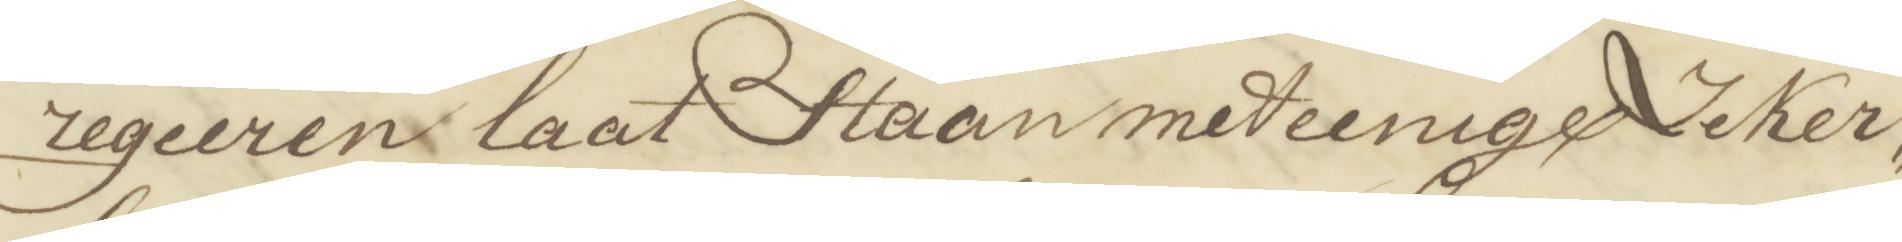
regeeren laat staan met eenige zeker„
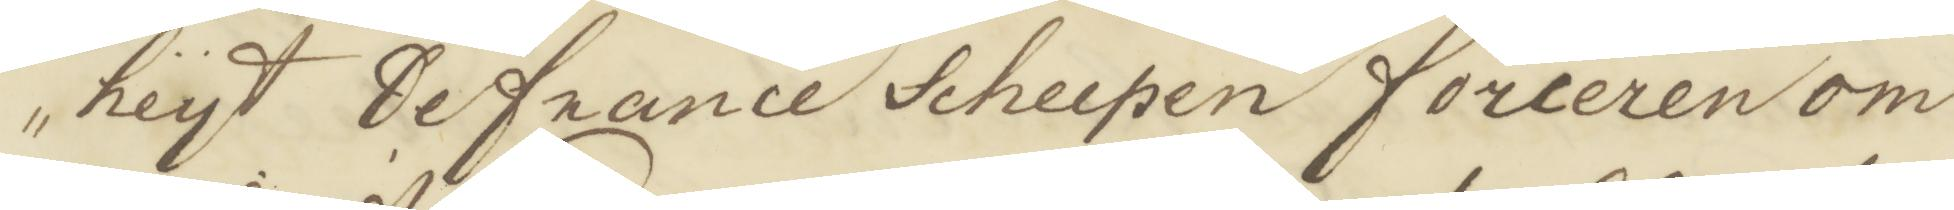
„heijt de france scheepen forceren om
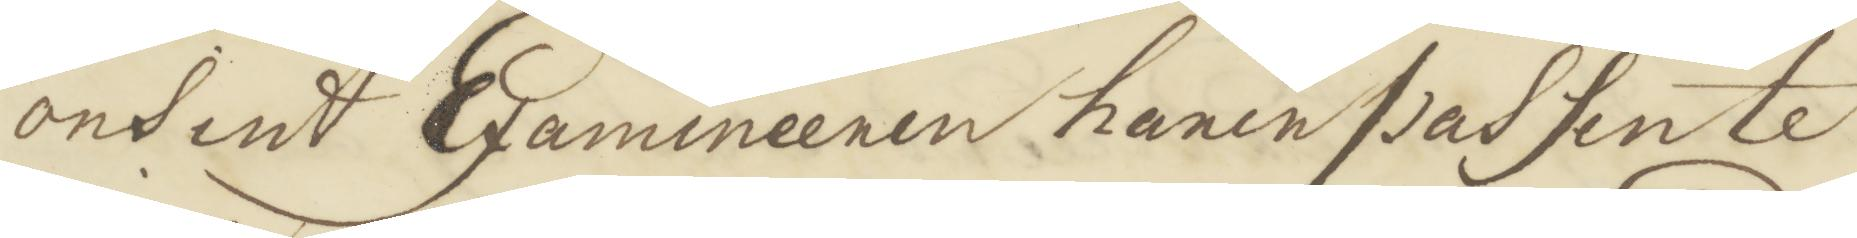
ons in't Examineeren haren passen te
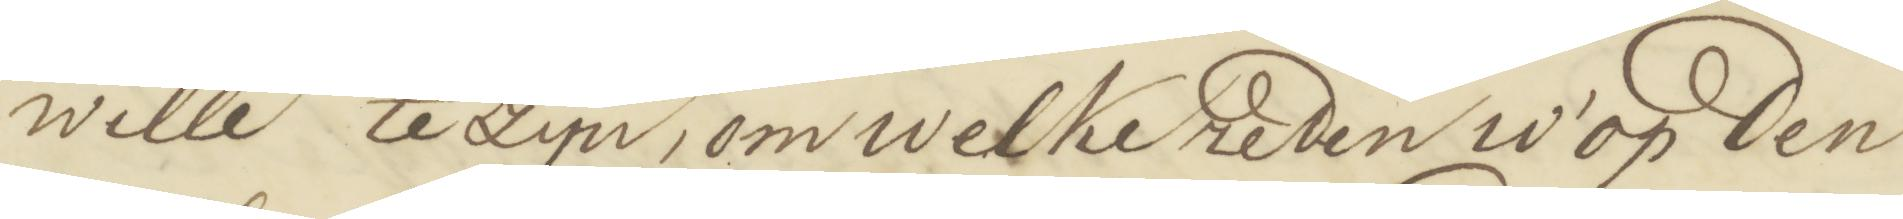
wille te zijn, om welke reden w'op den
